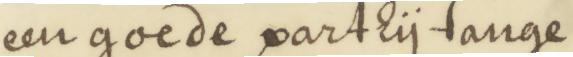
een goede parthij tange
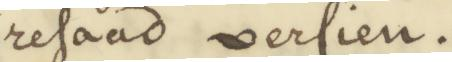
resaad versien.
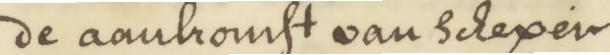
de aankomst van schepen
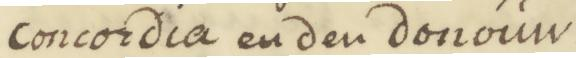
concordia en den donouw
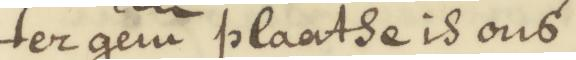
ter gem plaatse is ons
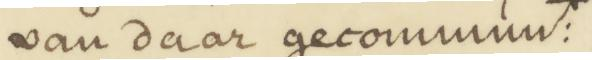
van daar gecommun:t
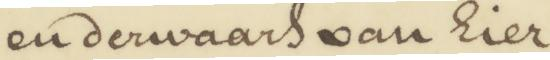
en derwaars van hier
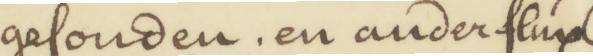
gesonden, en ander flux
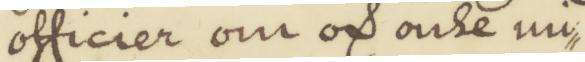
officier om over onse mi„
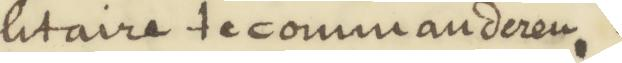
litaire te commanderen.
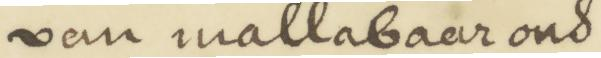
van mallabaar ons
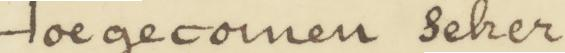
toe gecomen seker
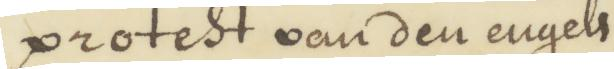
protest van den engels
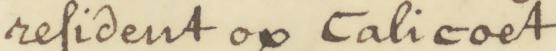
resident op calicoet
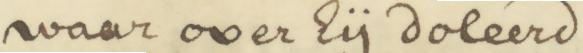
waar over hij doleerd
